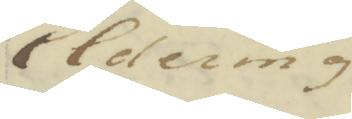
Eldering
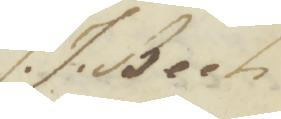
J. J. Bech
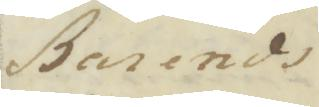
Barends
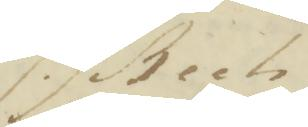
J. J Beets
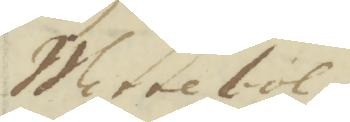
Wittebol
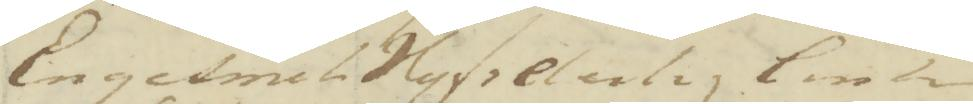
Engesmet Vyf en dertig Cents
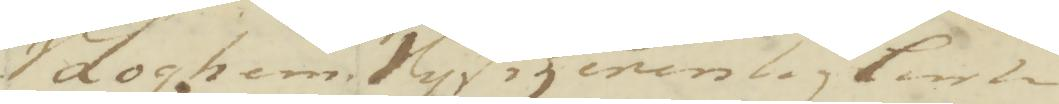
V Loghem. Vyf en zeventig Cents
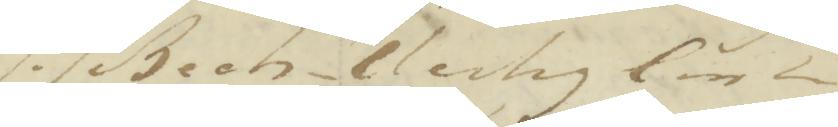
J. J Bech dertig Cents
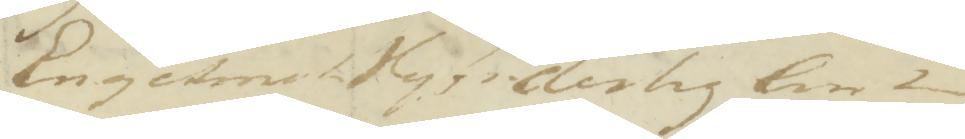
Engesmet Vyf en dertig Cent
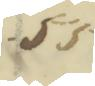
. 55
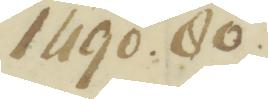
ƒ 1490. 80.
